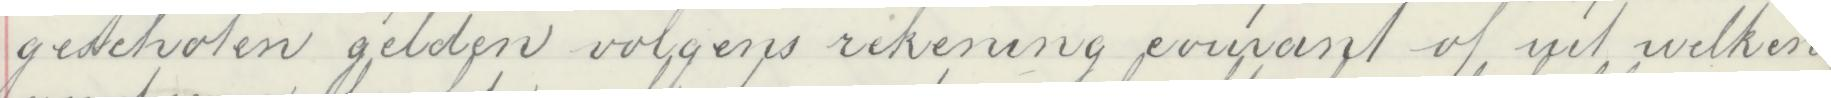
geschoten gelden volgens rekening courant of uit welken
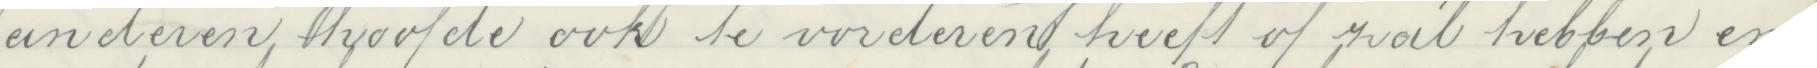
anderen hoofde ook te vorderen heeft of zal hebben en
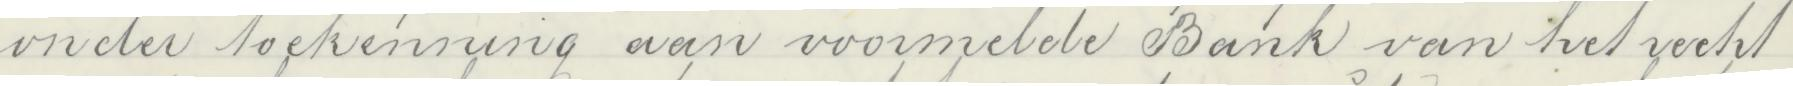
onder toekenning aan voormelde Bank van het recht
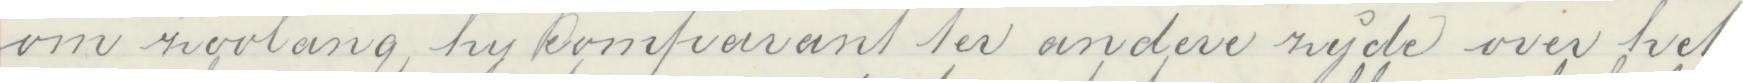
om zoolang hy Comparant ter andere zijde over het
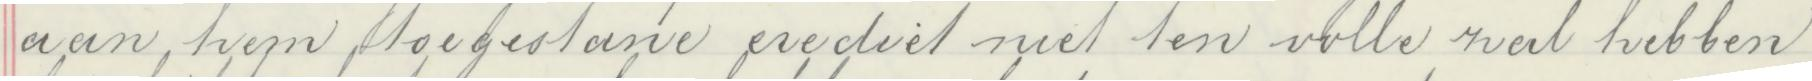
aan hem toegestane crediet niet ten volle zal hebben
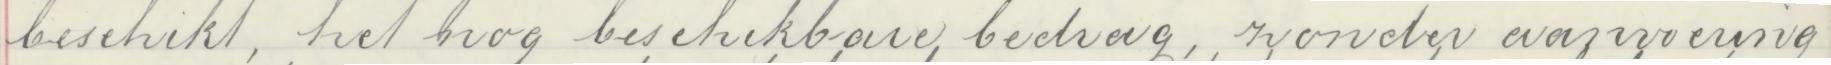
beschikt, het nog beschikbare bedrag, zonder aanvoering
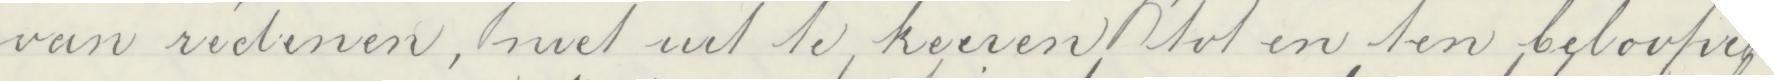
van redenen, niet uit te keeren tot en ten beloope
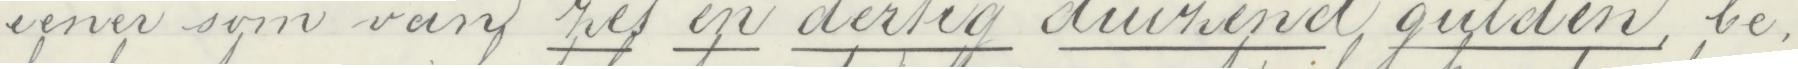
eener som van zes en dertig duizend gulden, be,
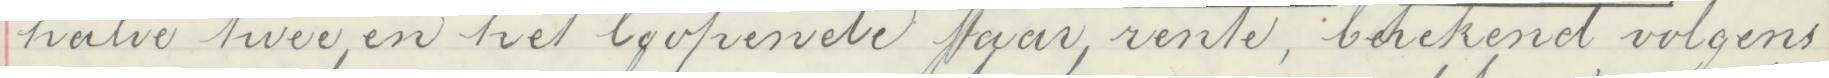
halve twee en het loopende Jaar rente, berekend volgens
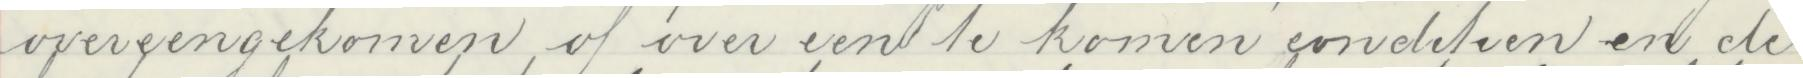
overeengekomen of over een te komen conditien en de
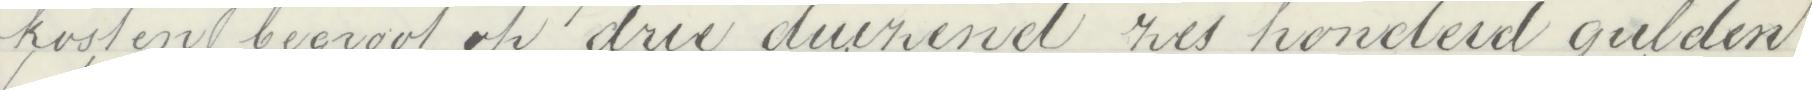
kosten begroot op drie duizend zes honderd gulden
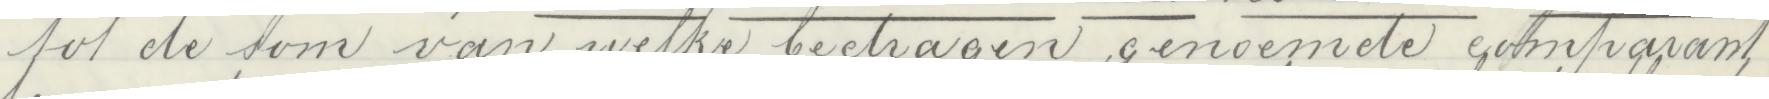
tot de som van welke bedragen, genoemde comparant
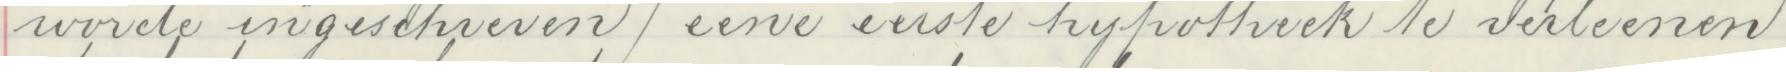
worde ingeschreven / eene eerste hypotheek te verleenen
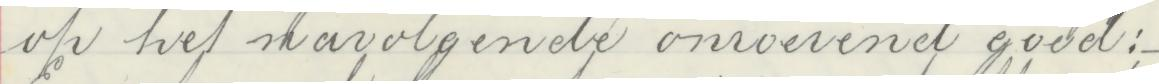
op het navolgende onroerend goed:
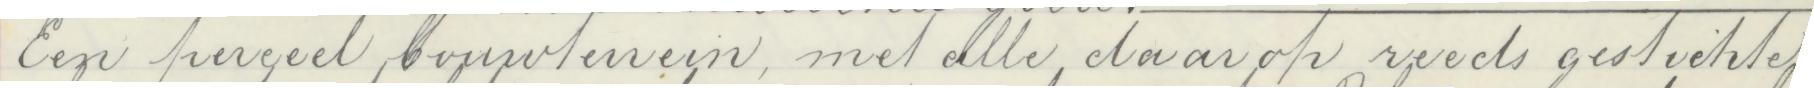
Een perceel bouwsterrein, met alle daarop reeds gestichte
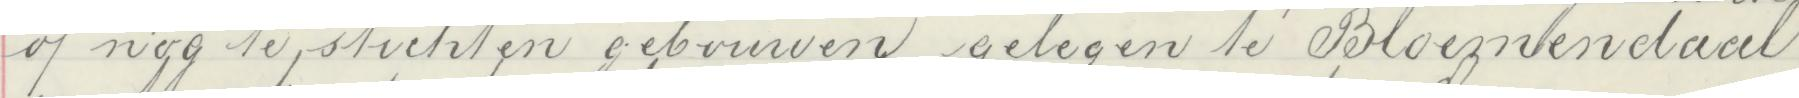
of nog te stichten gebouwen, gelegen te Bloemendaal
